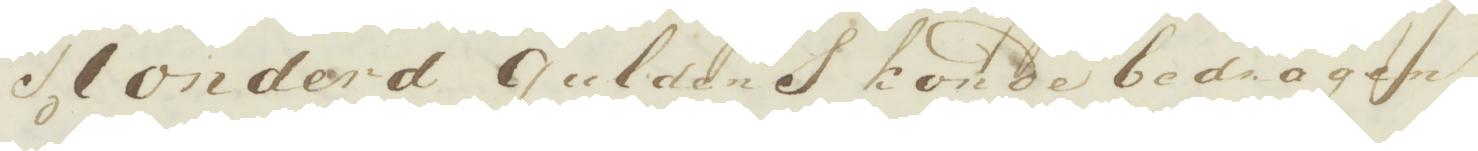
Honderd guldens konde bedragen,
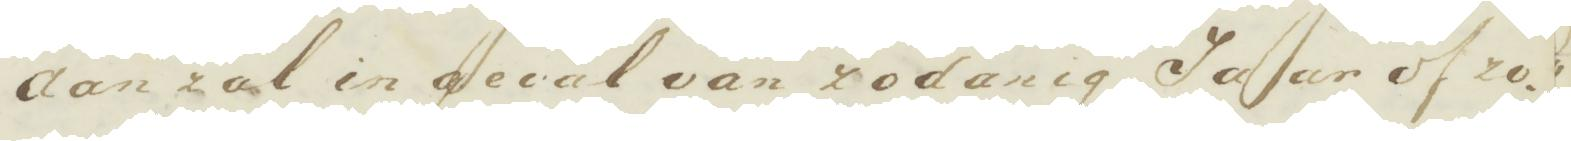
dan zal in geval van zodanig Jaar of zo„
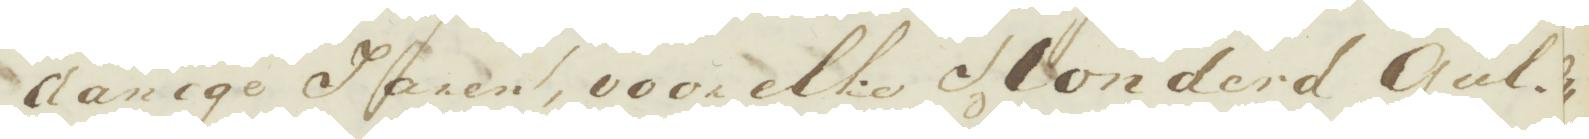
„danige Jaren, voor elke Honderd Gul„
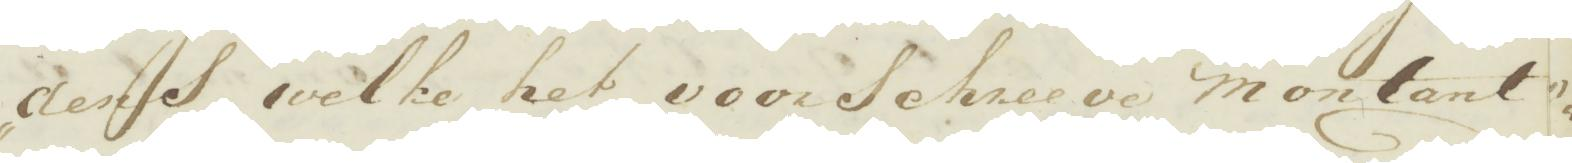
„dens welke het voorschreeve montant
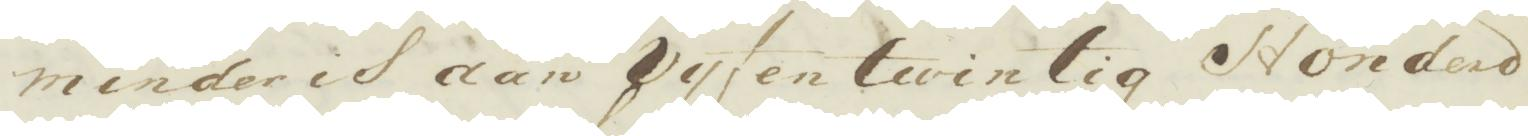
minder is aan vyf en twintig Honderd
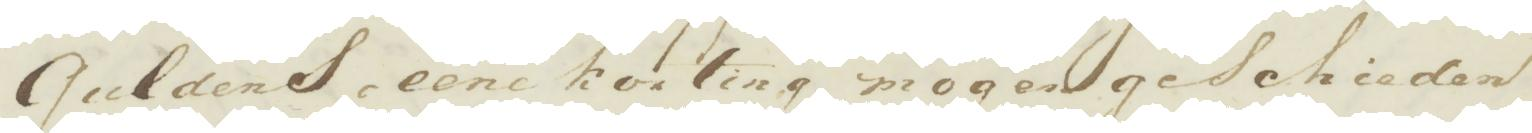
Guldens eene korting mogen geschieden
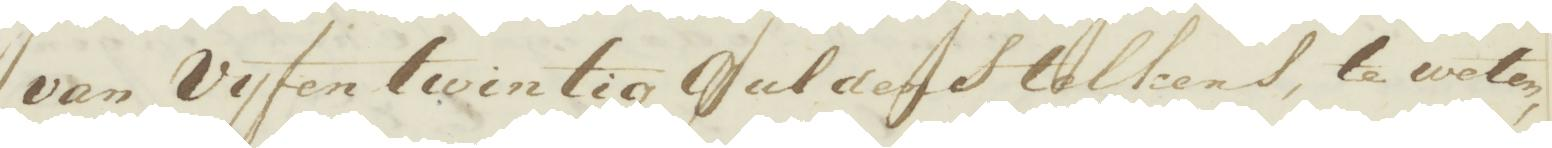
van Vyf en twintig guldens telkens, te weten
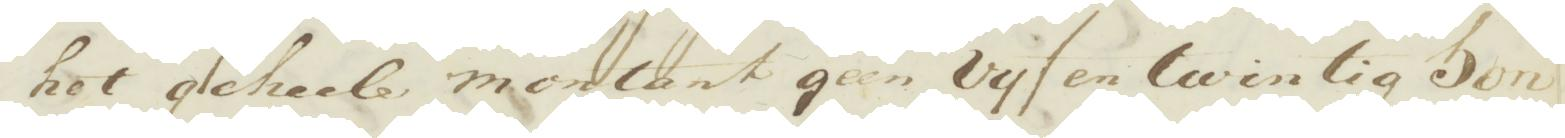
het geheel montant geen vyf en twintig Hon
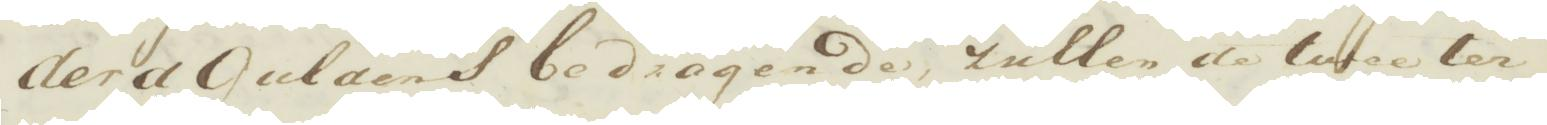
derd Guldens bedragende, zullen de twee ter
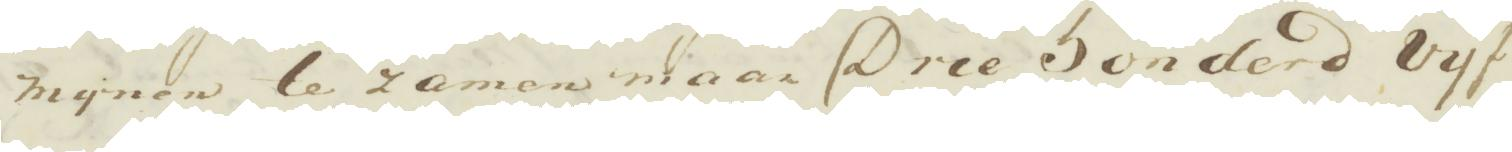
mijnen te zamen maar Drie Honderd vyf
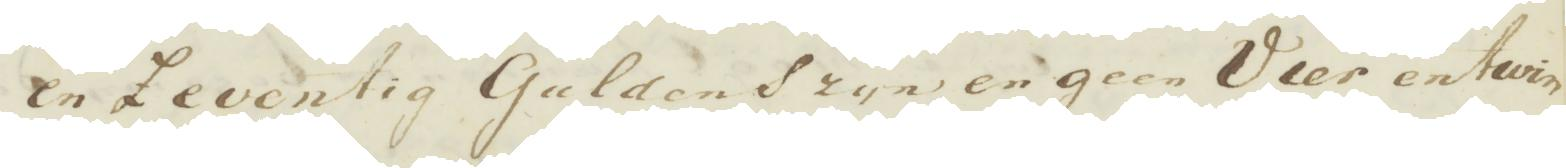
en Zeventig Guldens zyn en geen Vier en twin
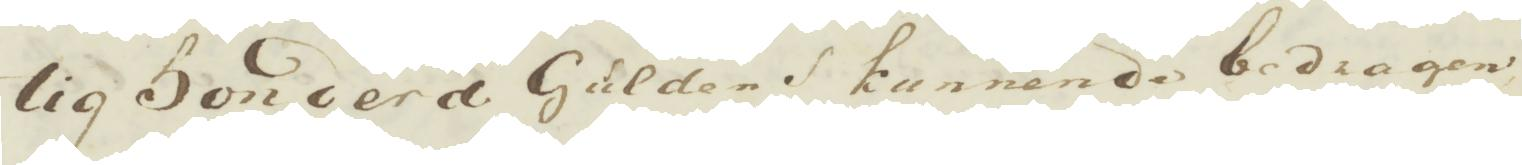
tig Honderd Guldens kunnende bedragen
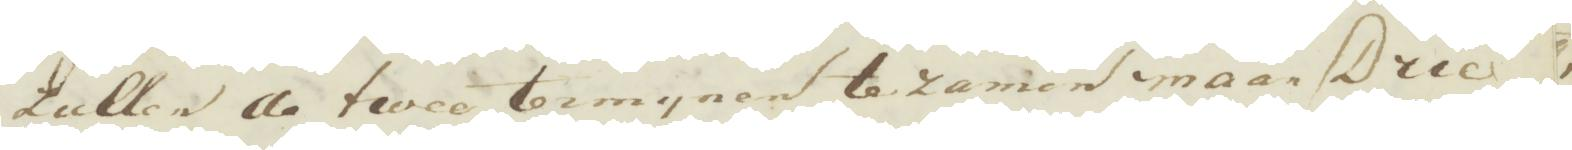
zullen de twee termynen te zamen maar Drie
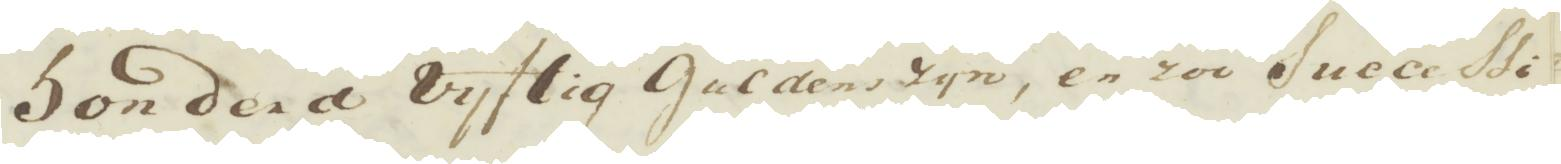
Honderd Vyftig Guldens zyn, en zoo Successi
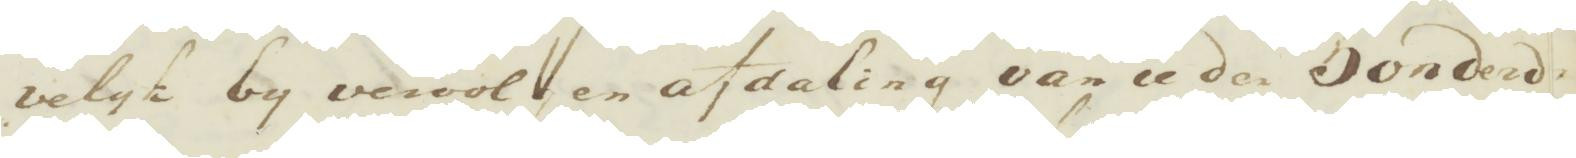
„velyk bij vervolg en afdaling van ieder Honderd
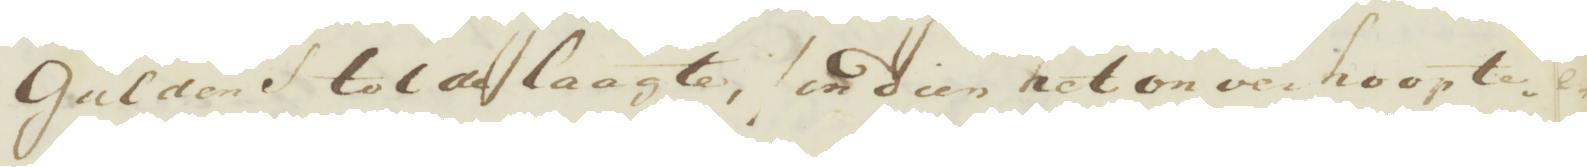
guldens tot de laagte, / indien het onverhoopte„
